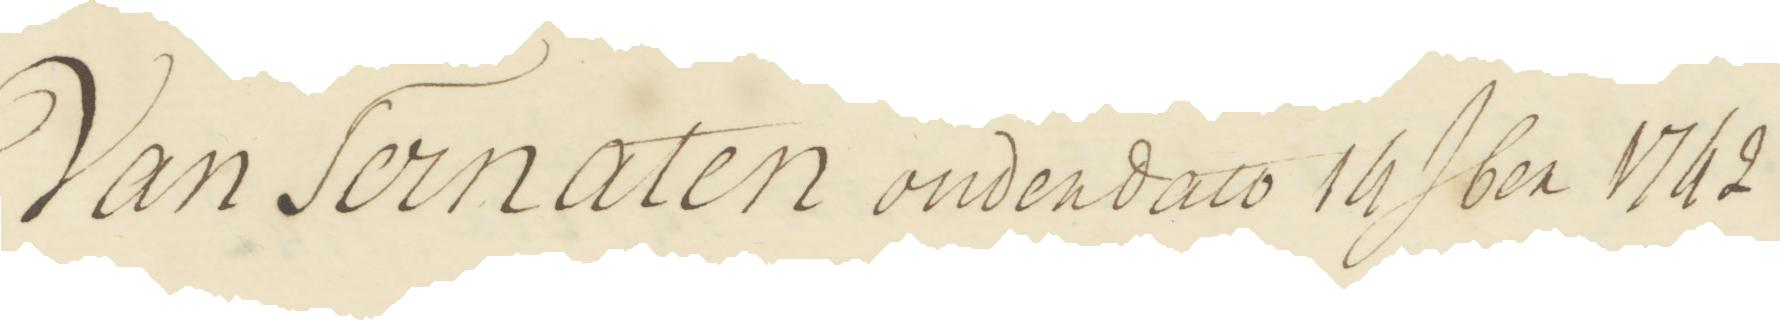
Van Ternaten onder dato 14 7ber 1742
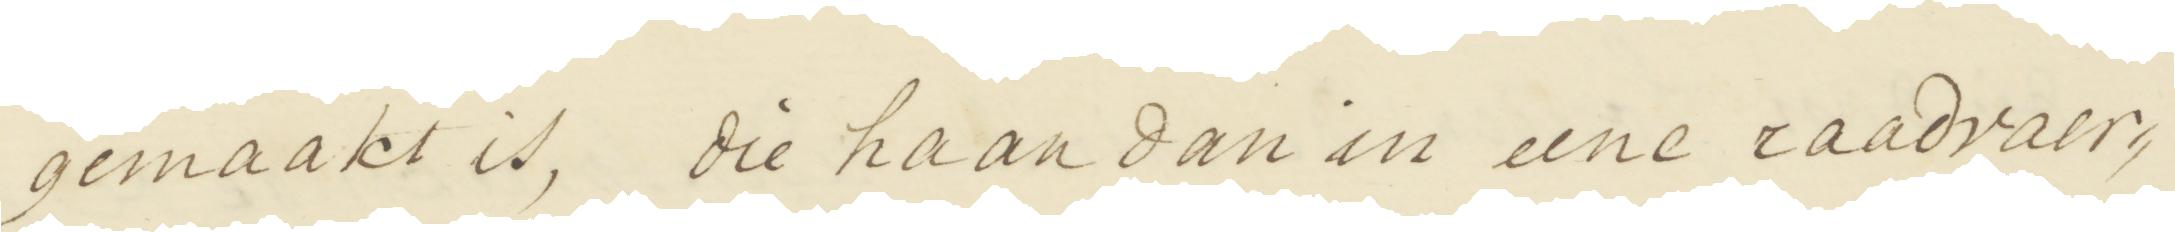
gemaakt is, die haar dan in eene raadvaer„
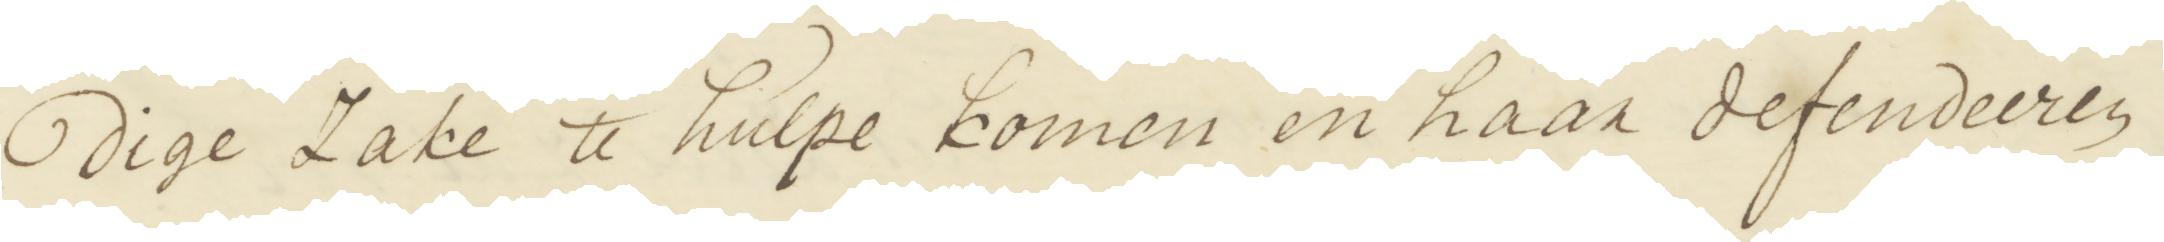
dige zake te hulpe komen en haar defendeeren
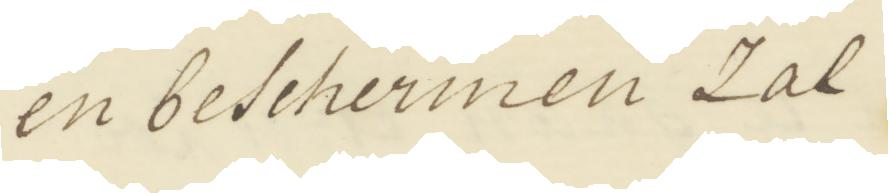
en beschermen zal
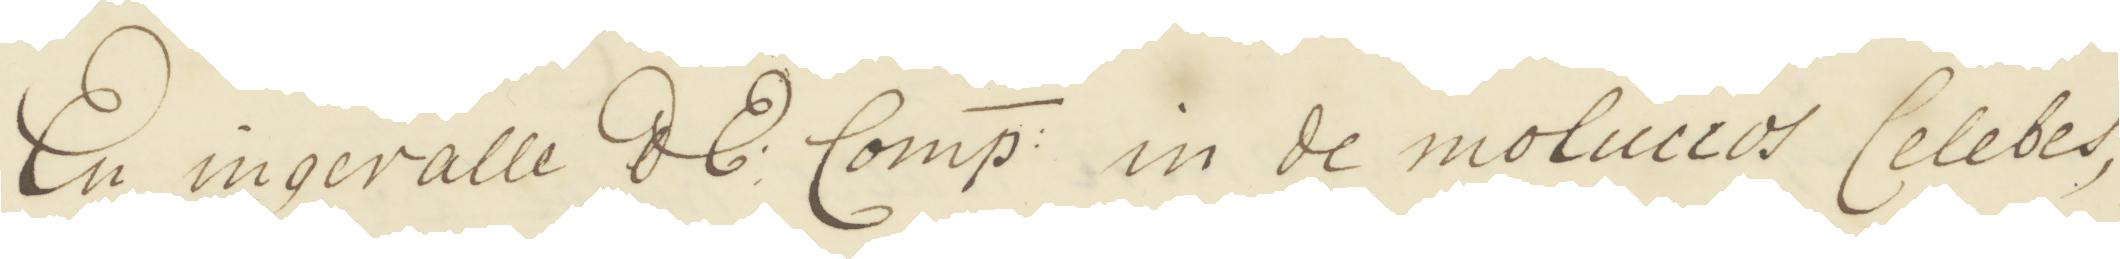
En ingevalle dE: Comp: in de moluccos Celebes,
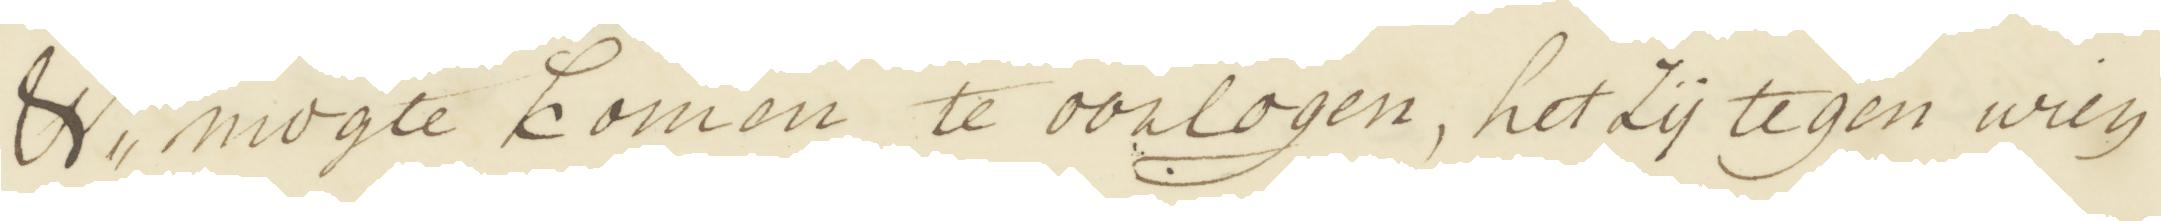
&„a mogte komen te oorlogen, het zij tegen wien
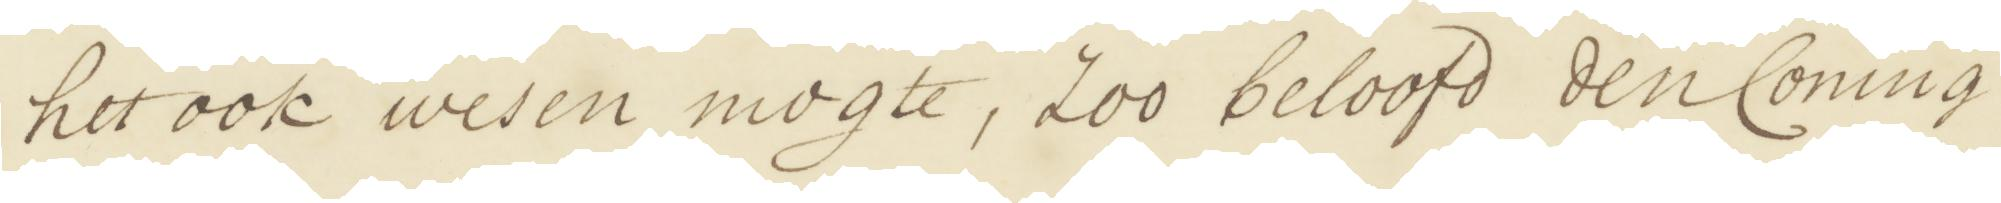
het ook wesen mogte, zoo beloofd den Coning
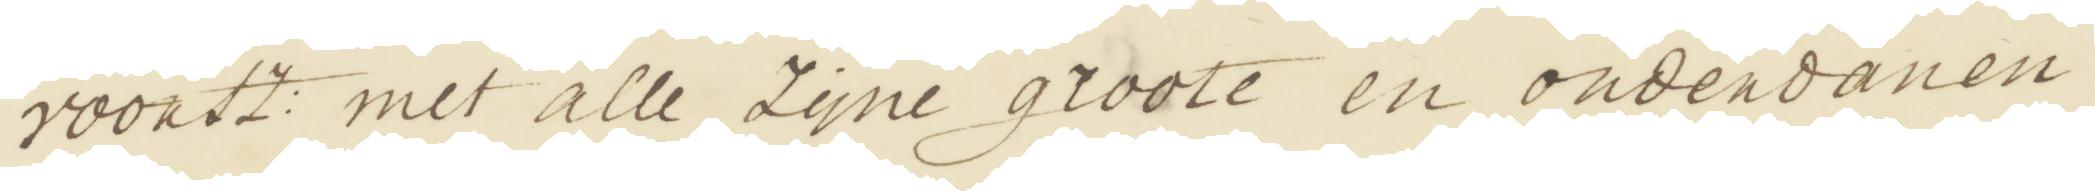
voorsz: met alle zijne groote en onderdanen
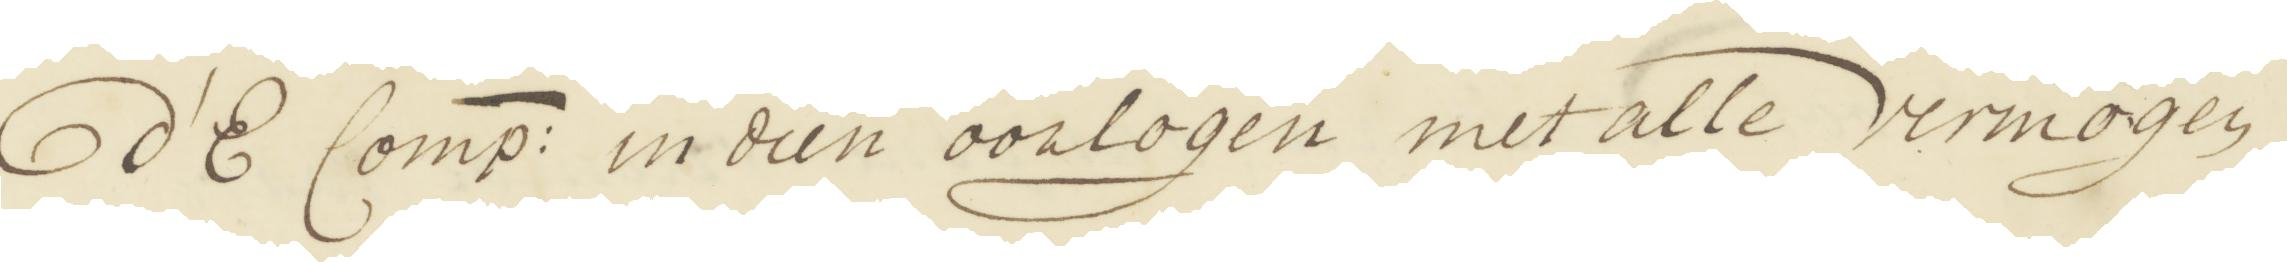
d’E Comp: in dien oorlogen met alle vermogen
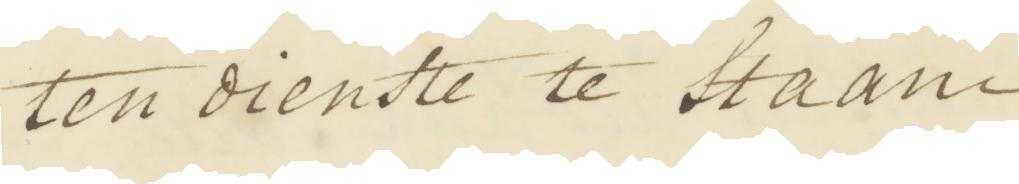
ten dienste te staan
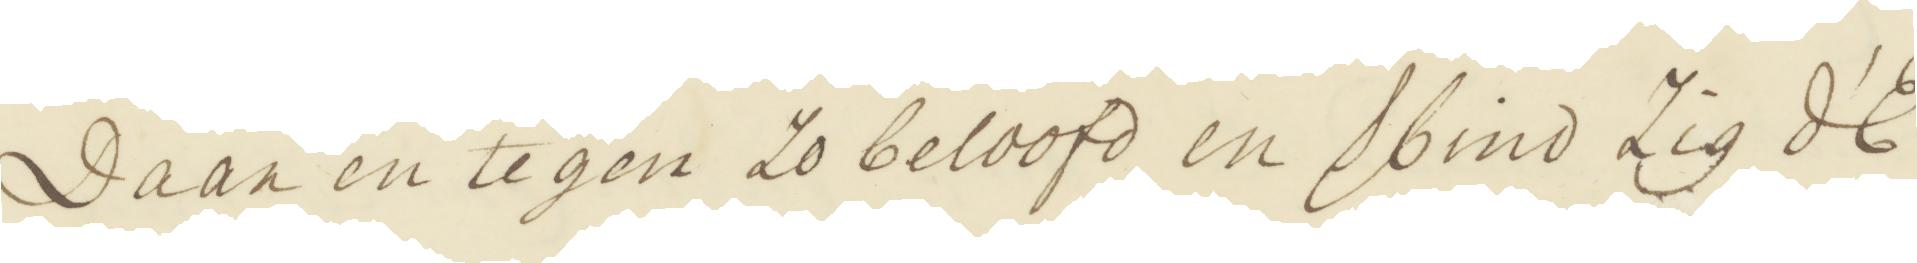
Daar en tegen zo beloofd en verbind zig d'E
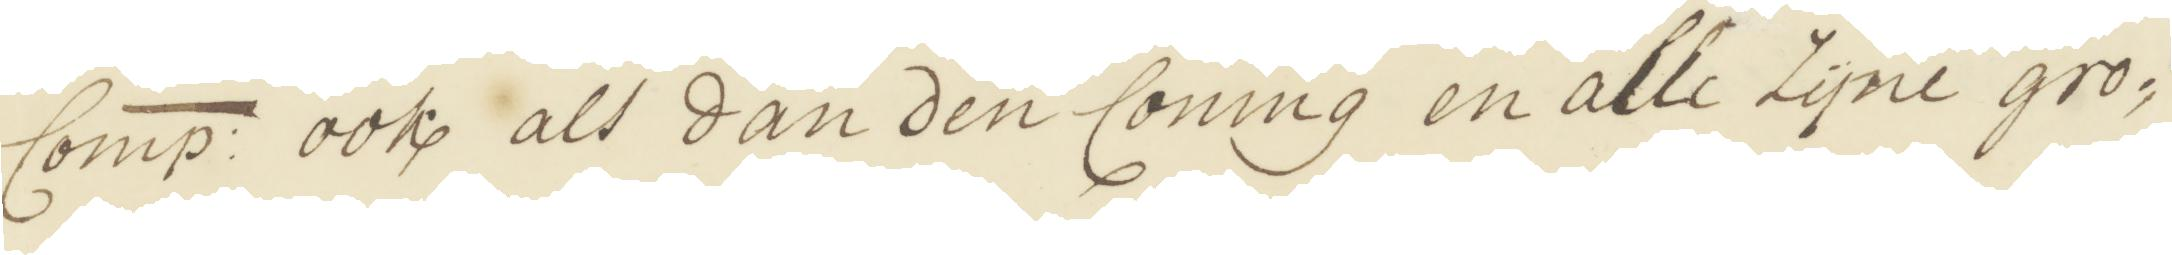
Comp: ook als dan den Coning en alle zijne gro„
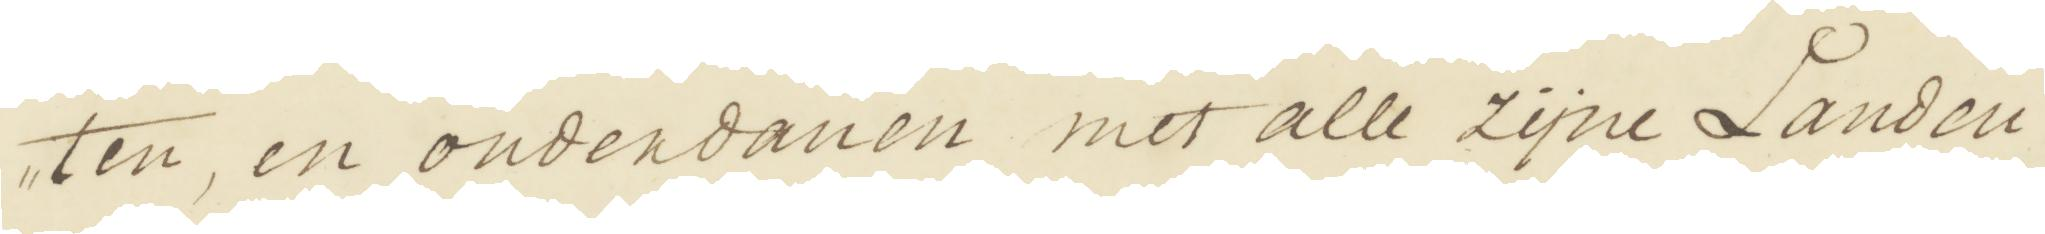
„ten, en onderdanen met alle zijne Landen
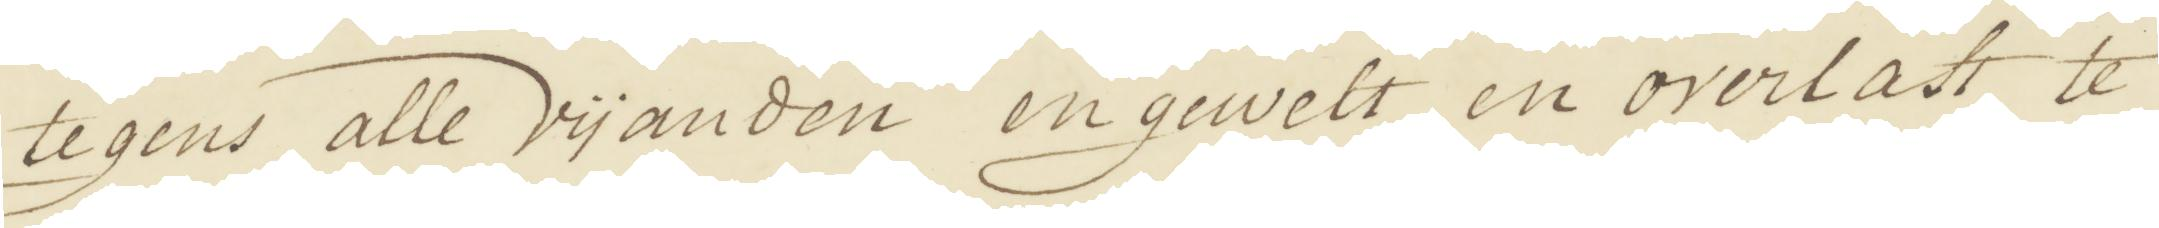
tegens alle vijanden en gewelt, en overlast te
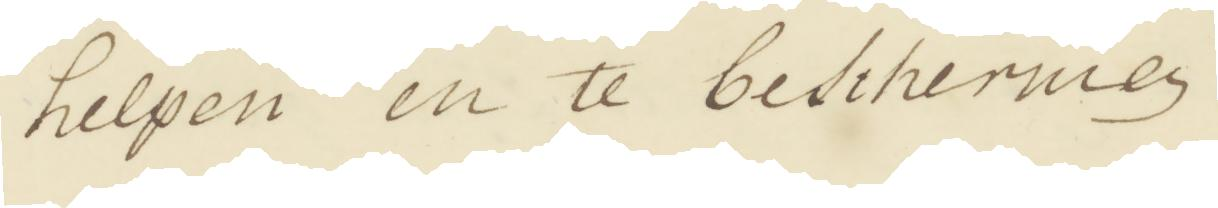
helpen en te beschermen
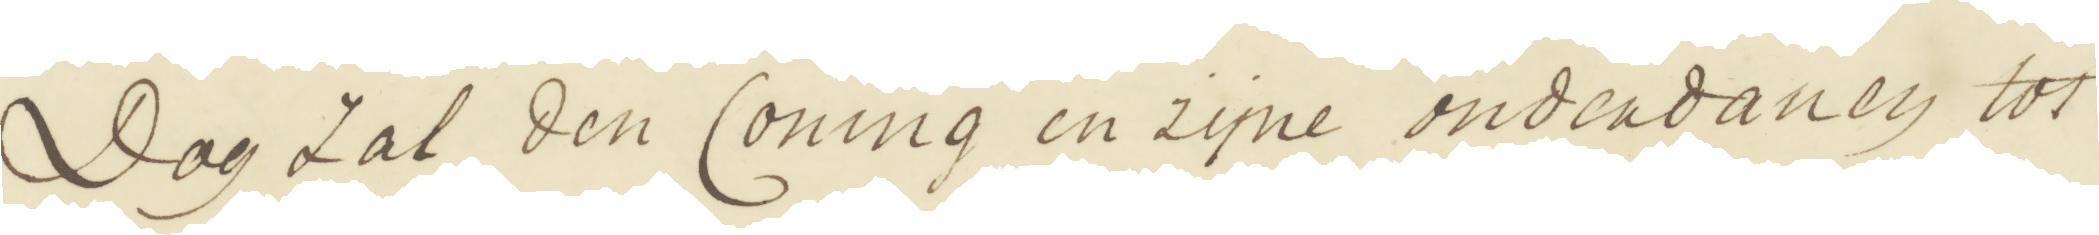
Dog zal den Coning en zijne onderdanen tot
